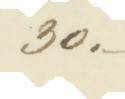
30„
